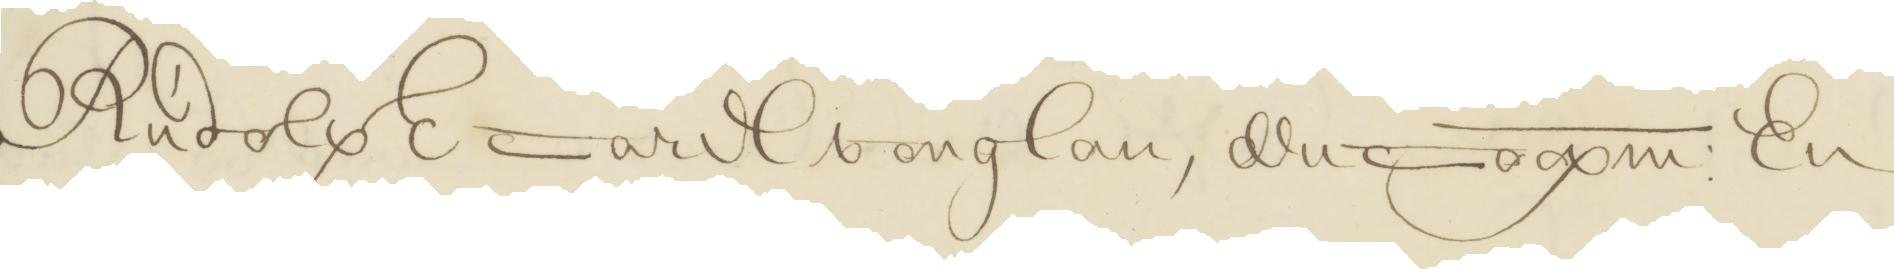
Rudolph carel vonglan, den coopm: En
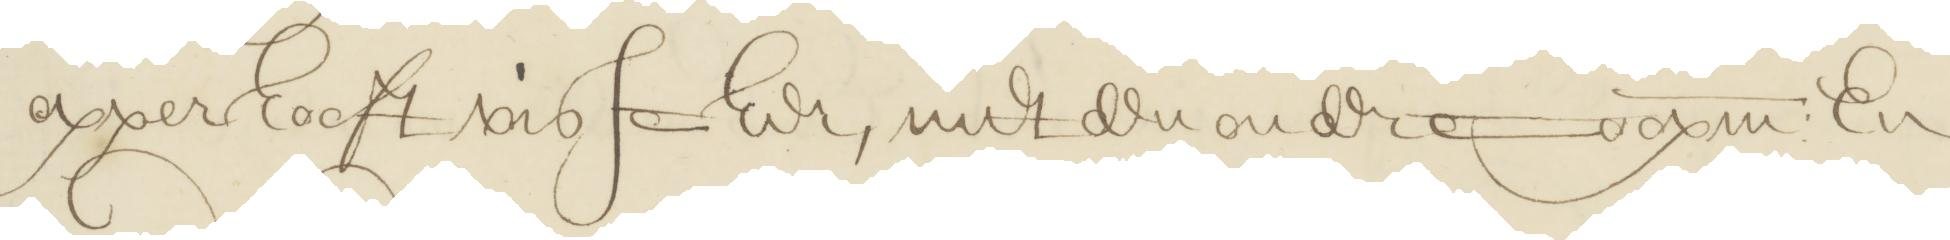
opperhooft visscher, met den ondercoopm: En
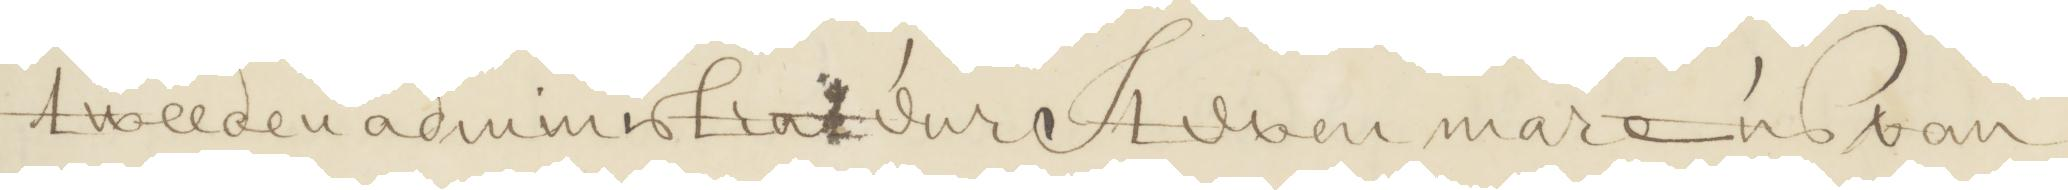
tweeden administrateur steven marcus van
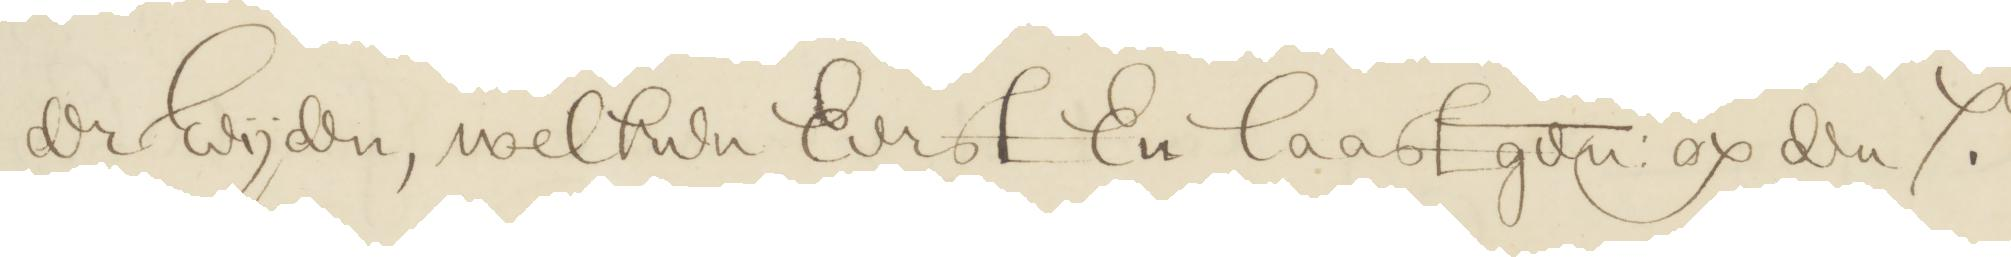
der heijden, welken Eerst En laast gen: op den 7.
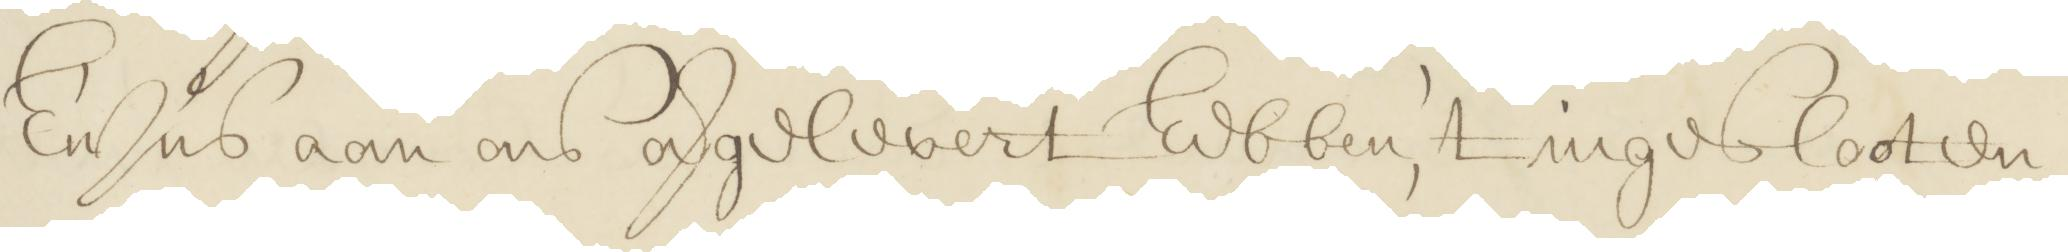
Eujus aan ons overgelevert hebben, ’t ingeslooten
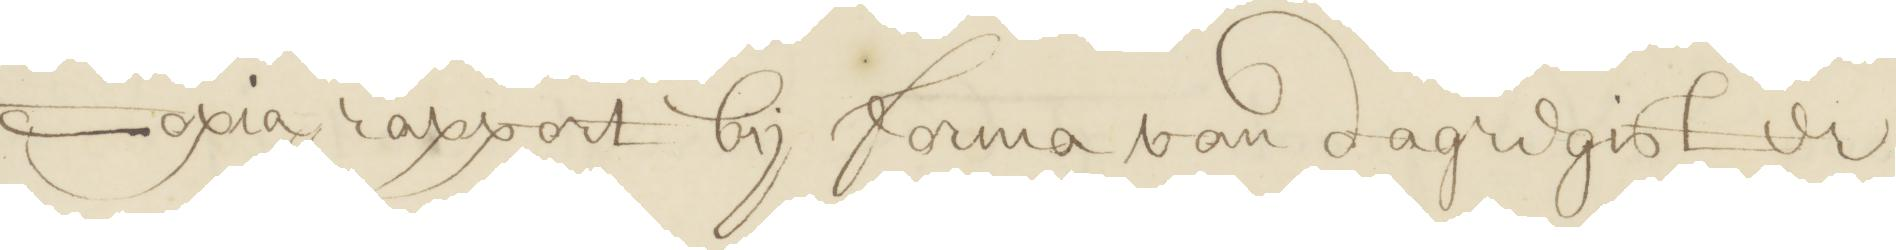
copia rapport bij forma van dagregister
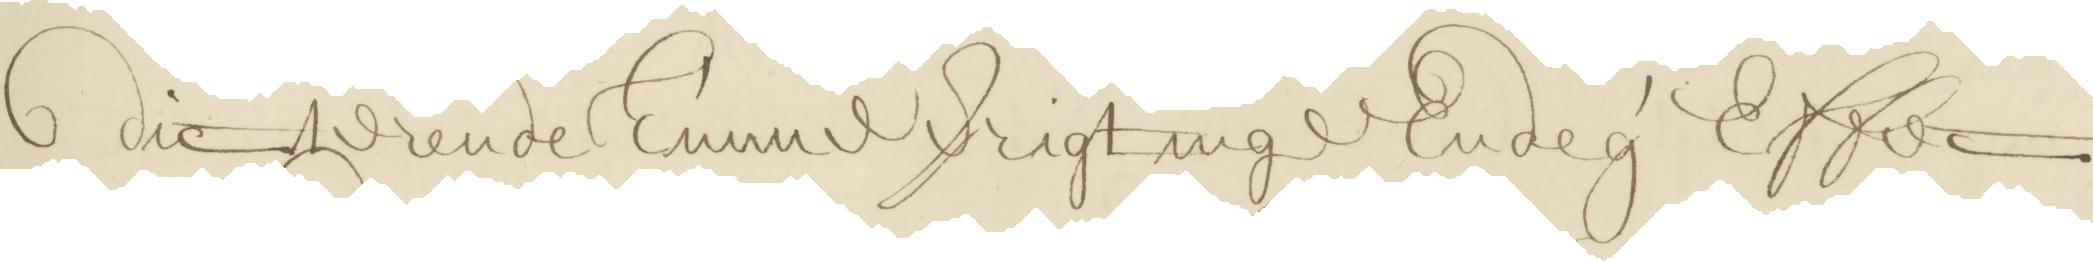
dicterende hunne verrigtinge Ende g’ Effec
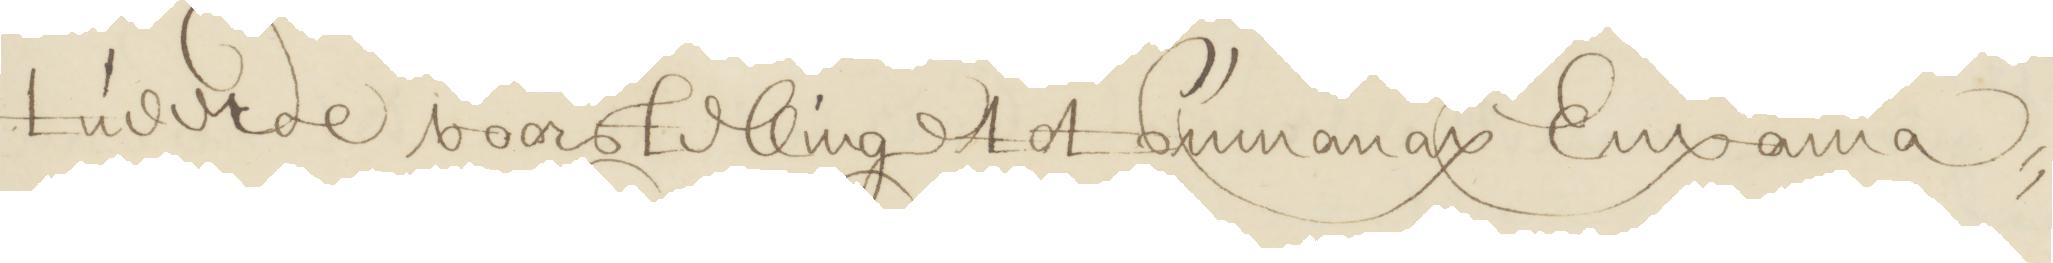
tueerde voorstellinge tot sumanap Enpama„
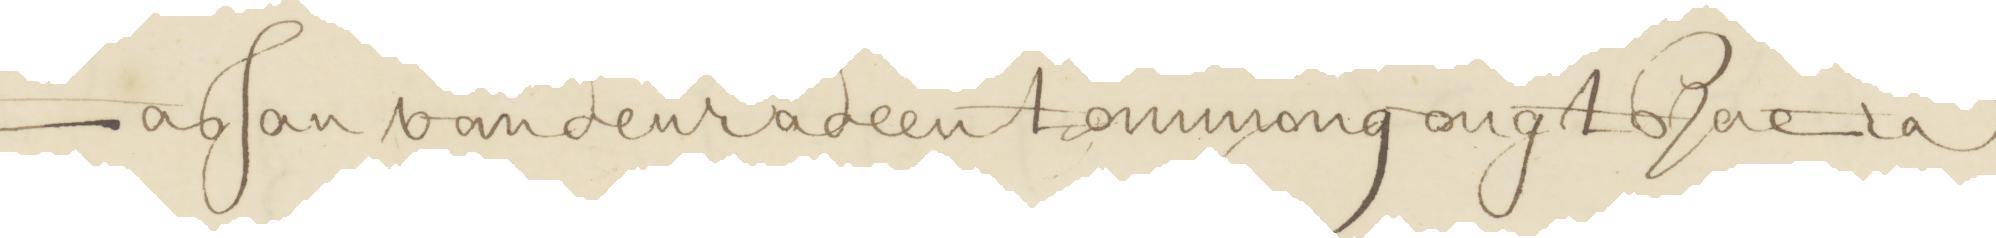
cassan van denradeen tommongongt sjacta
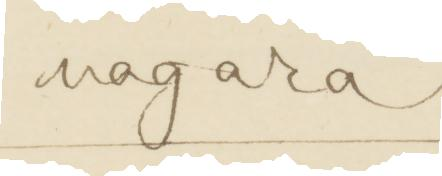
nagara
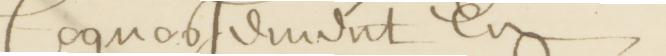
Cognossement En
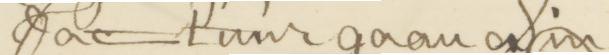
factuur gaan over in
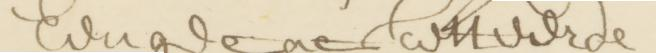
Een gecachetteerde
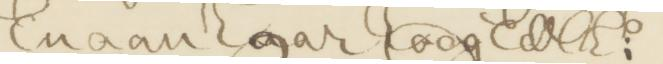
En aan haar hoog Edelh:s
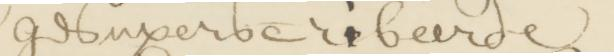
gesuperscribeerde
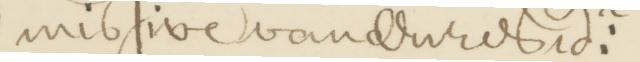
missive van den resid:t
